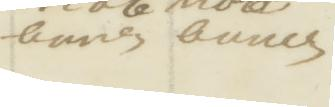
bomen bomen
